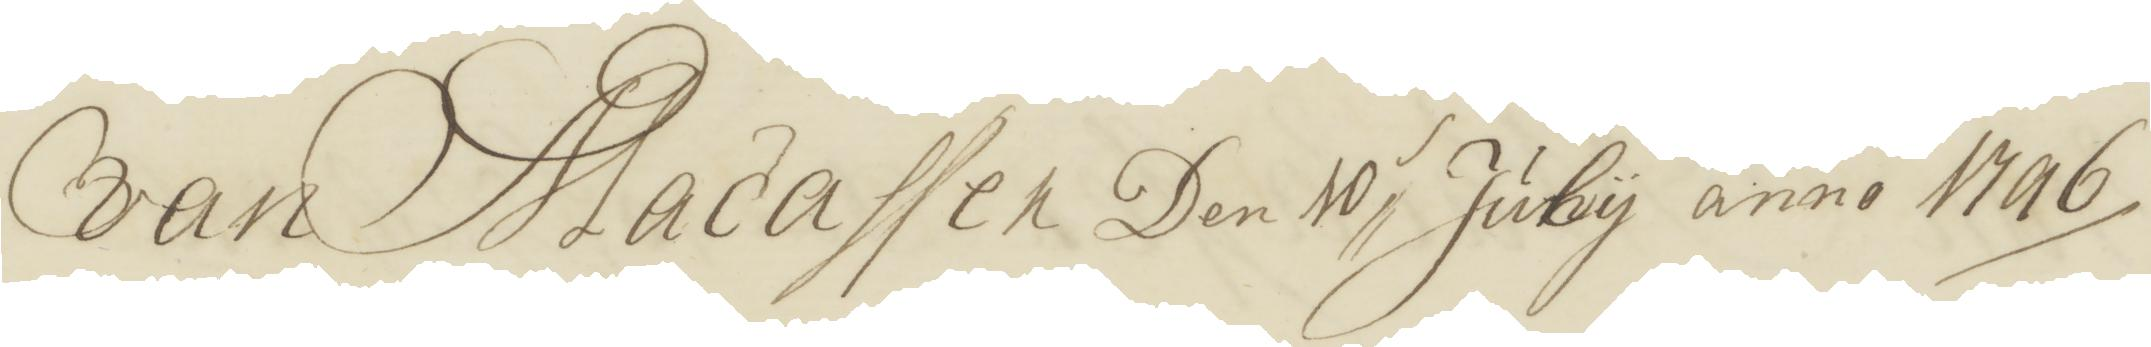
Van Macasser Den 10„' Julij anno 1746/
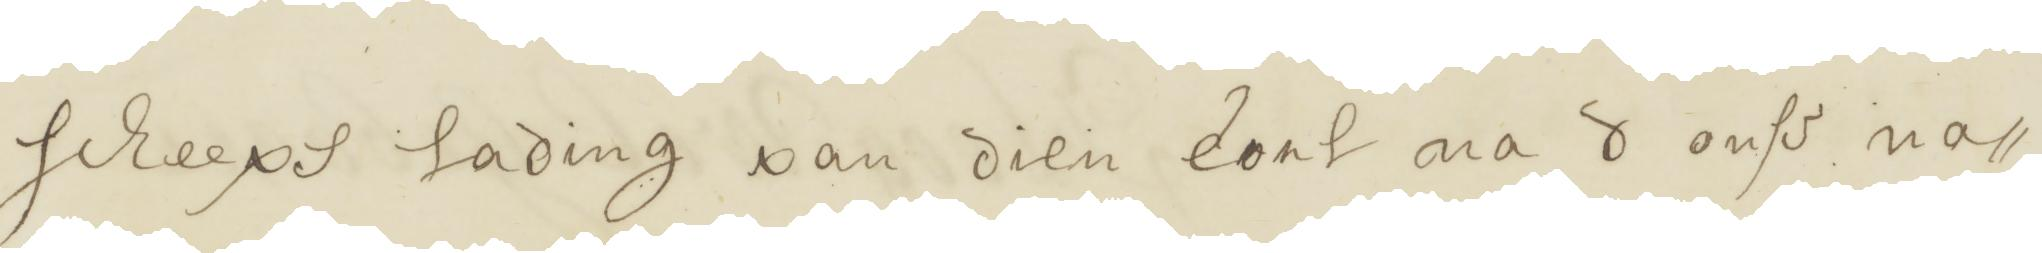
scheeps lading van dien cors na d onse na„
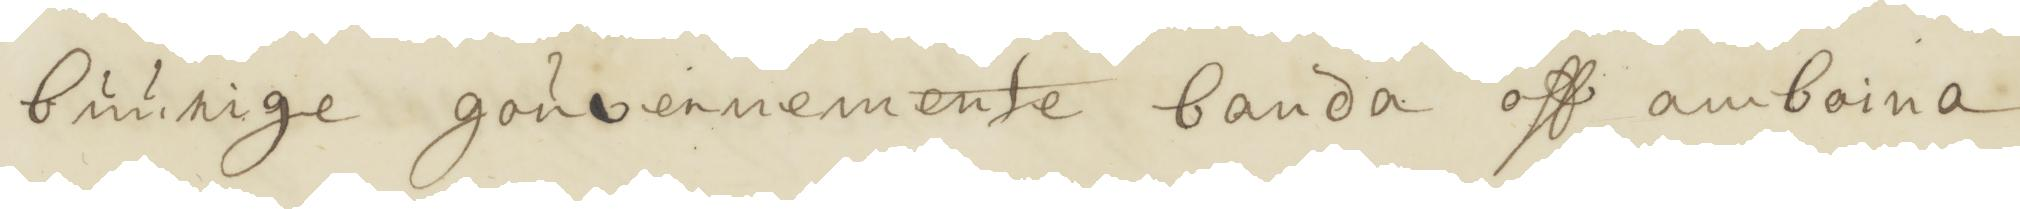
buurige gouvernemente banda off amboina
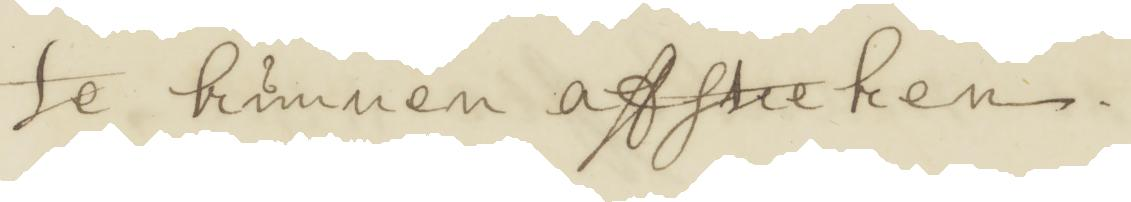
te kunnen affsteeken.
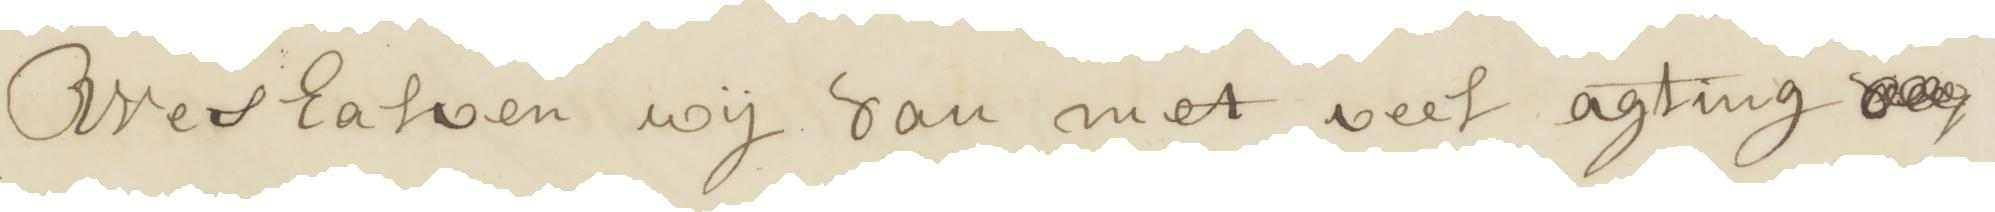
Weshalven wij dan met veel agting dee
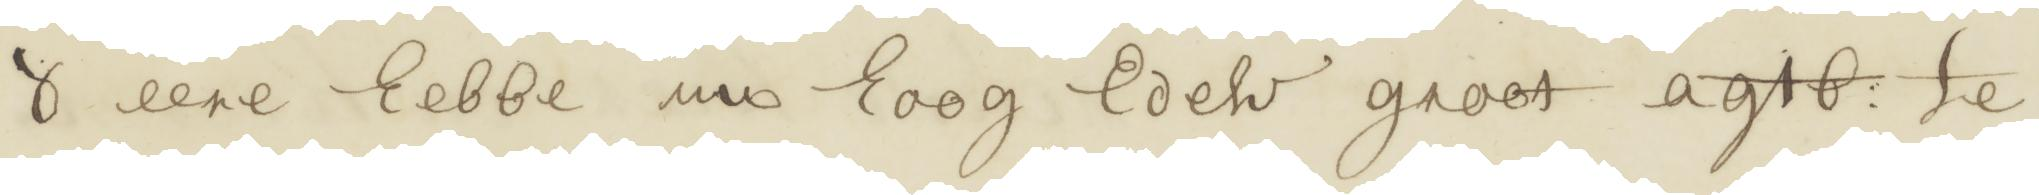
d eere hebbe uw hoog Edele groot agtb: te
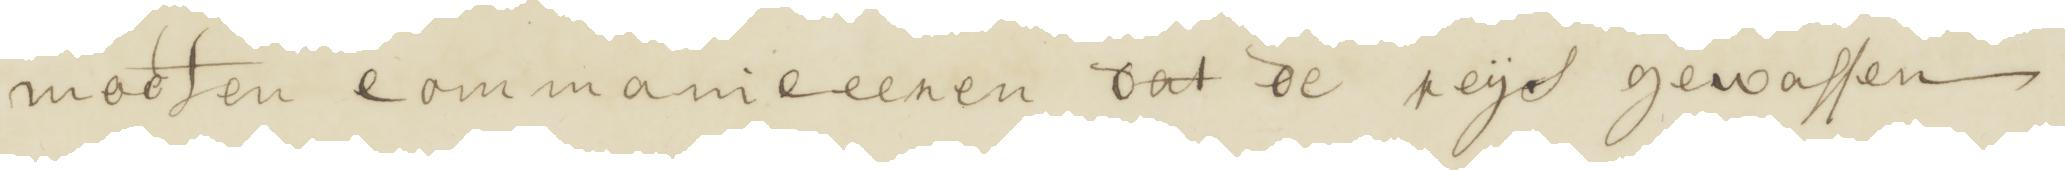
moeten commaniceeren dat de reijs gewassen
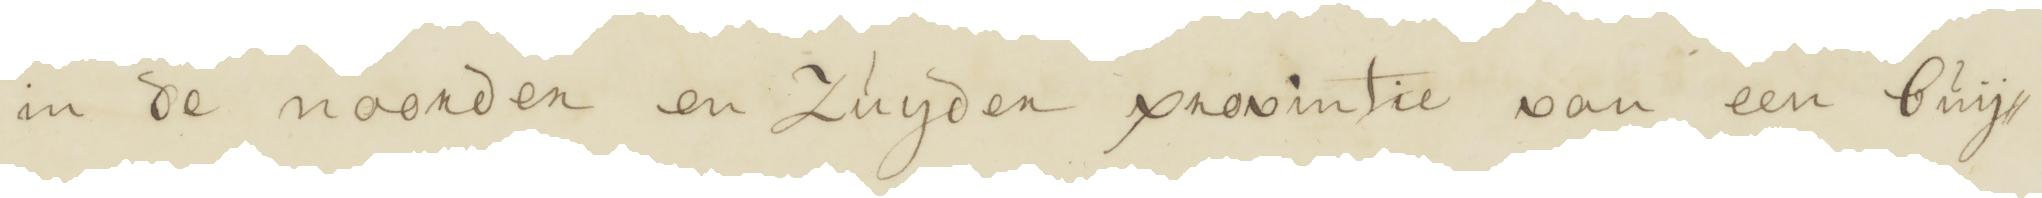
in de noorder en zuijder provintie van een buij„
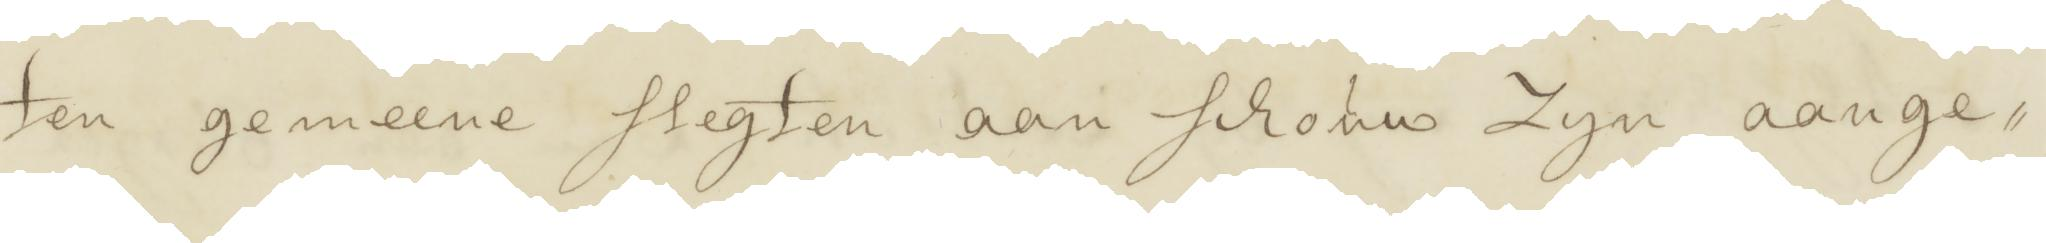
ten gemeene slegten aan schouw zyn aange„
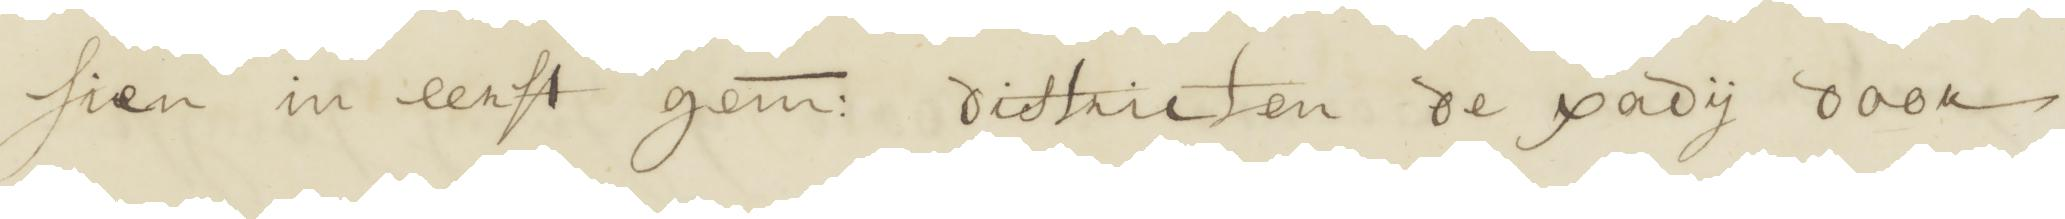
sien in eerst gem: districten de padij door
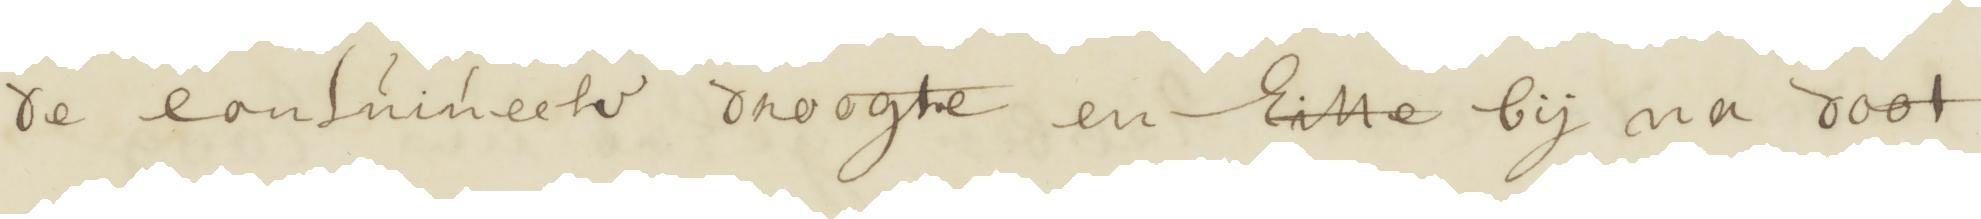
de contuiueele droogte en hitte bij na doot
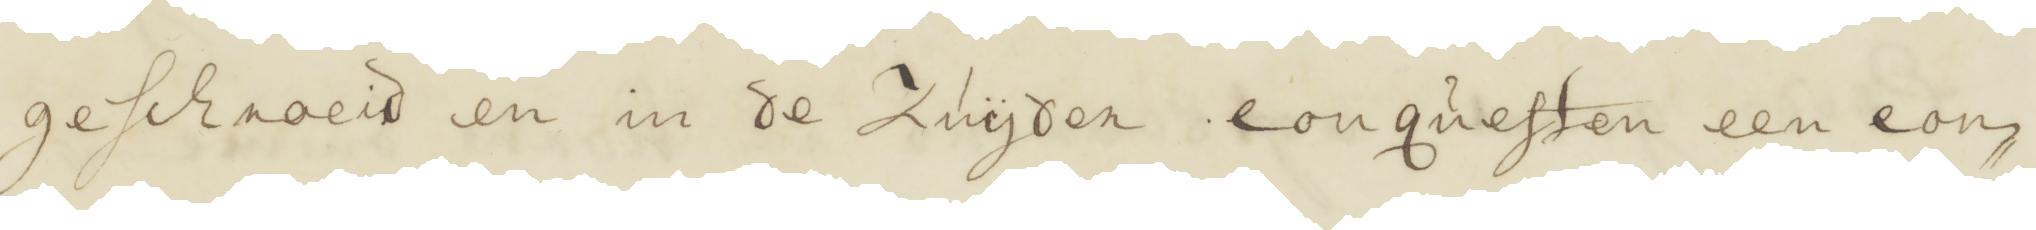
geschroeid en in de zuijder conquesten een con„
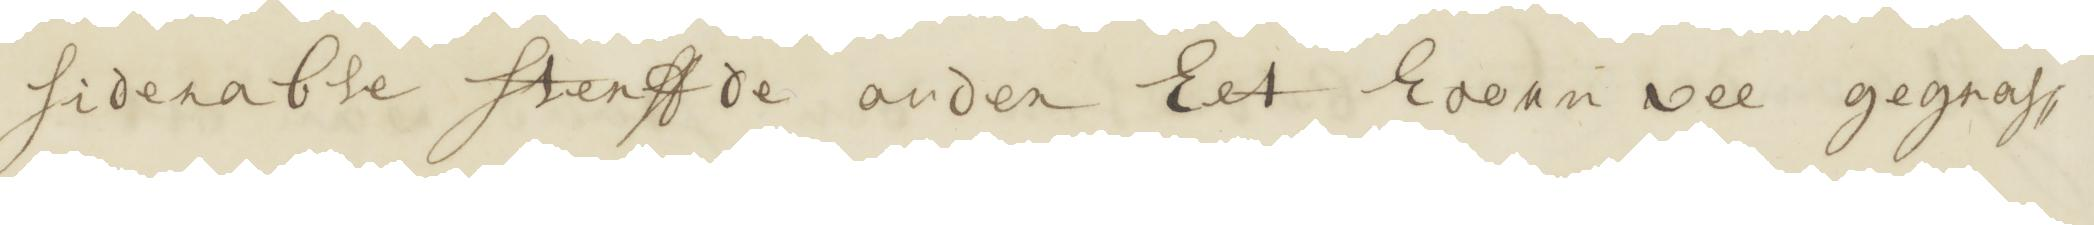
siderable sterff de onder het hoornvee gegras„
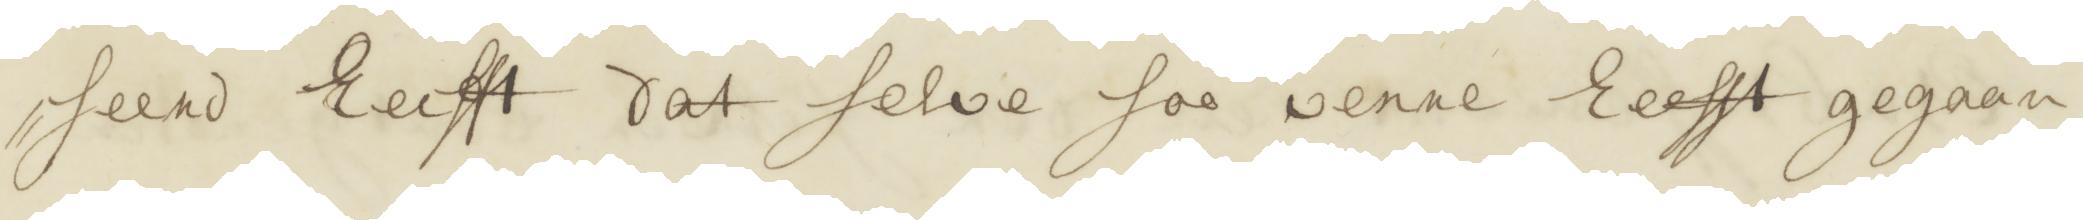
„seerd heefft dat selve soo verre heefft gegaan
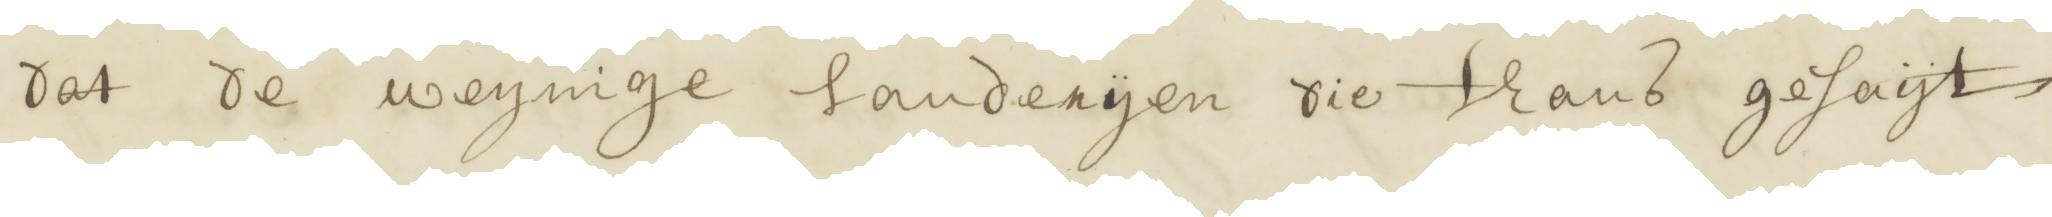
dat de weynige landerijen die thans gesaijt
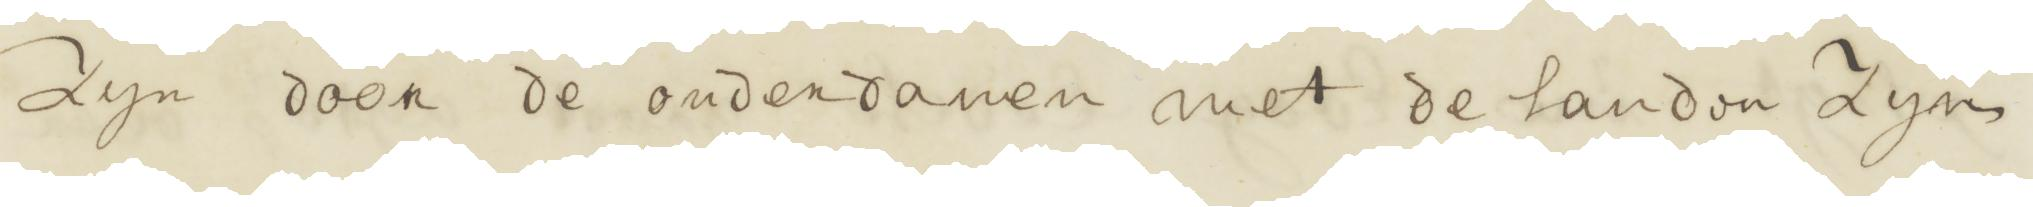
zijn door de onderdanen met de landen zyn
